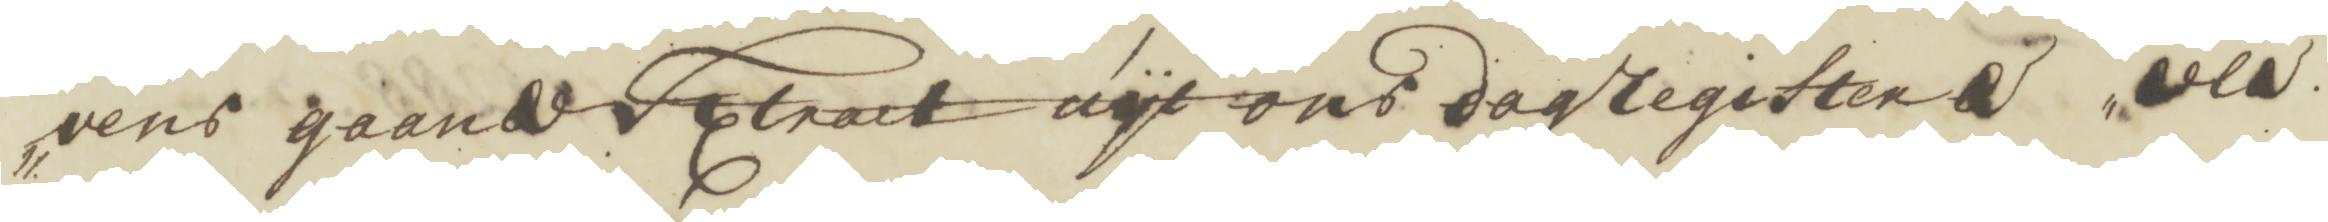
„vens gaande Extract uijt ons dag register de „delde.
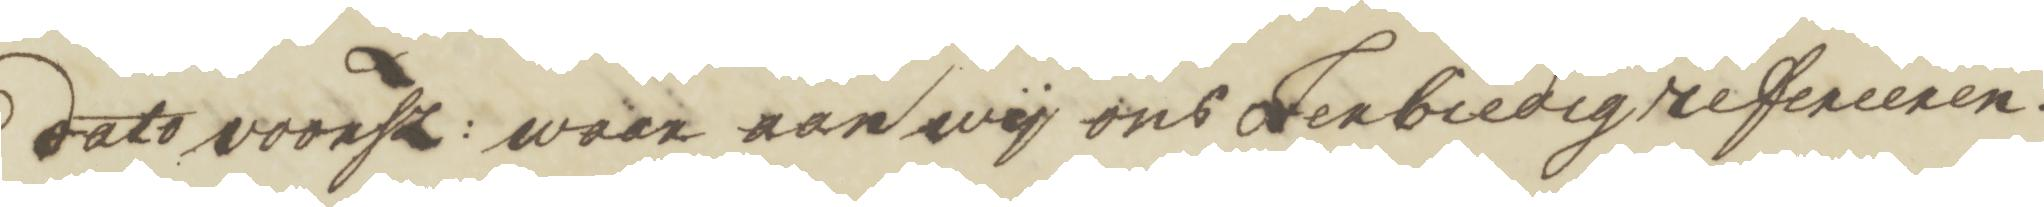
dato voorsz: waar aan wij ons Eerbiedig refereeren
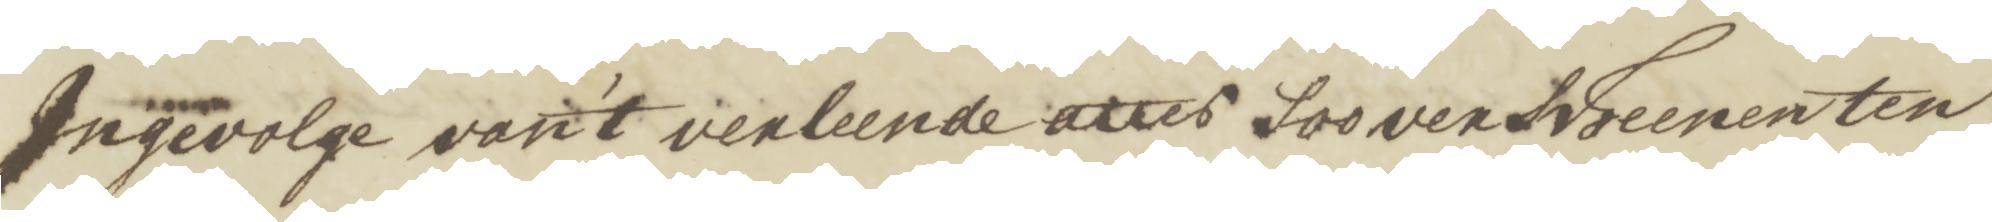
Jngevolge van ’t verleende attes soo verscheenen ten
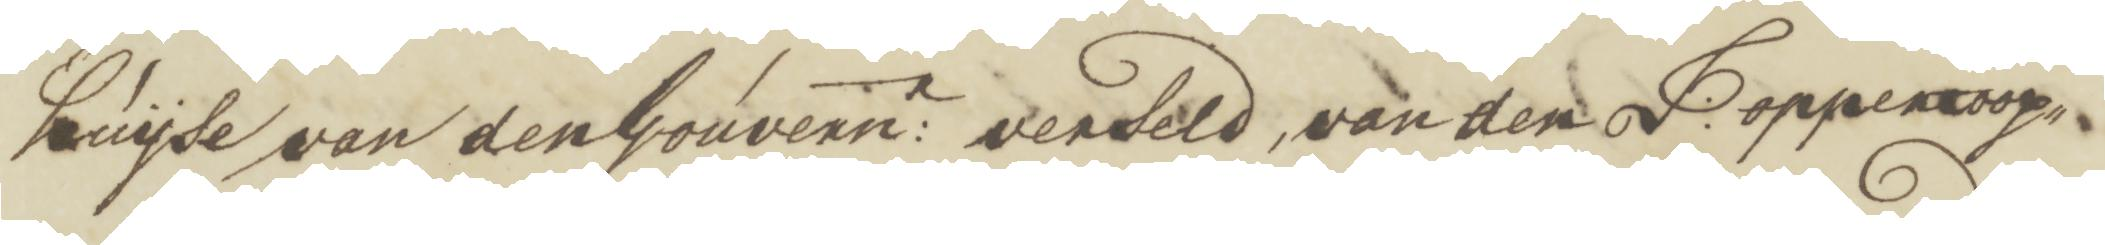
huijse van den Gouvern:r verseld, van den E: oppercoop„
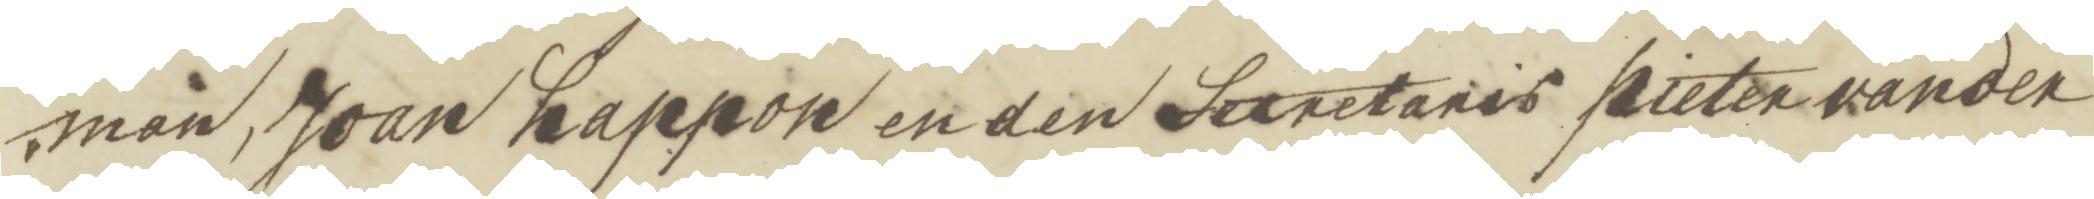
„man, Joan happon en den secretaris pieter vander
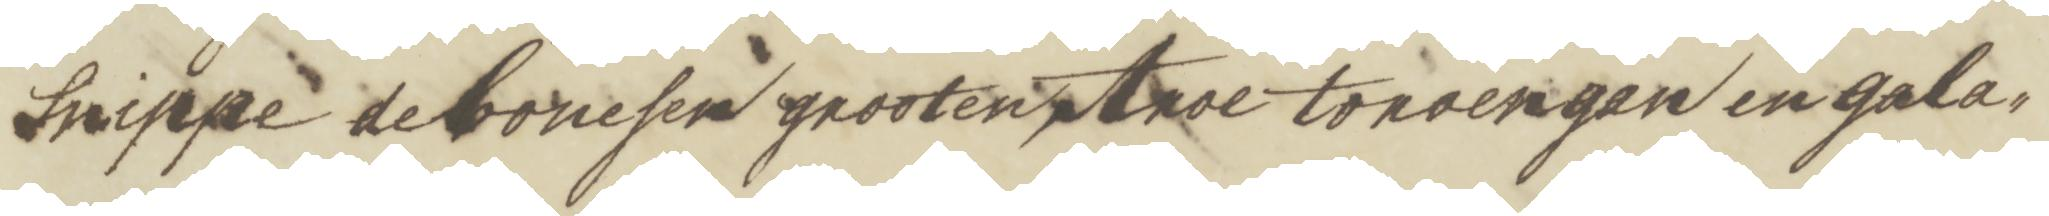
snippe de bonesen grooten, troe toroengan en gala„
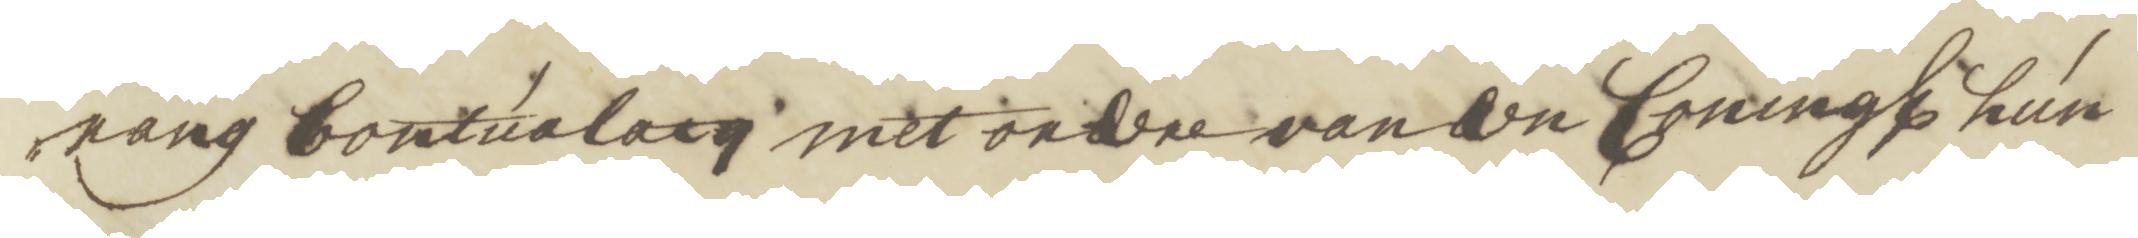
„rang bontualacq met ordere van den Coningh hun
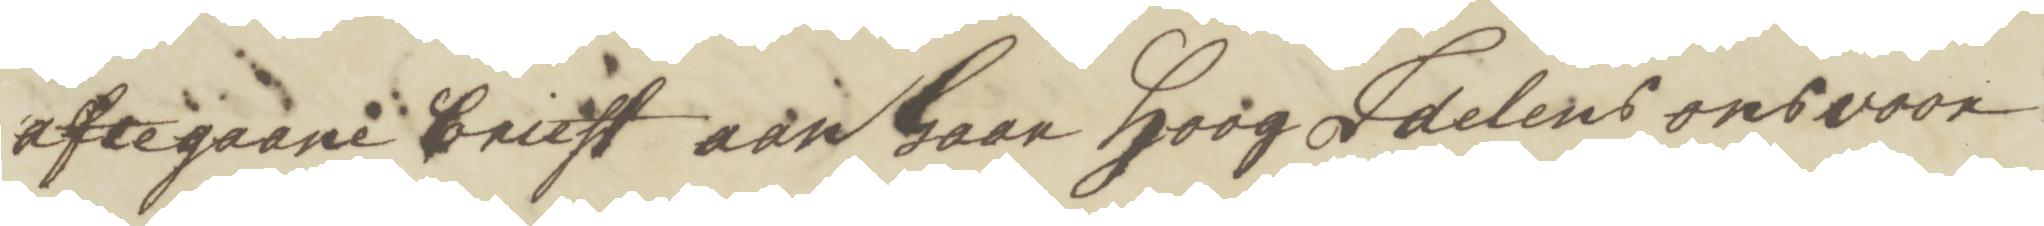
aftegaane brieff aan haar Hoog Edelens ons voor
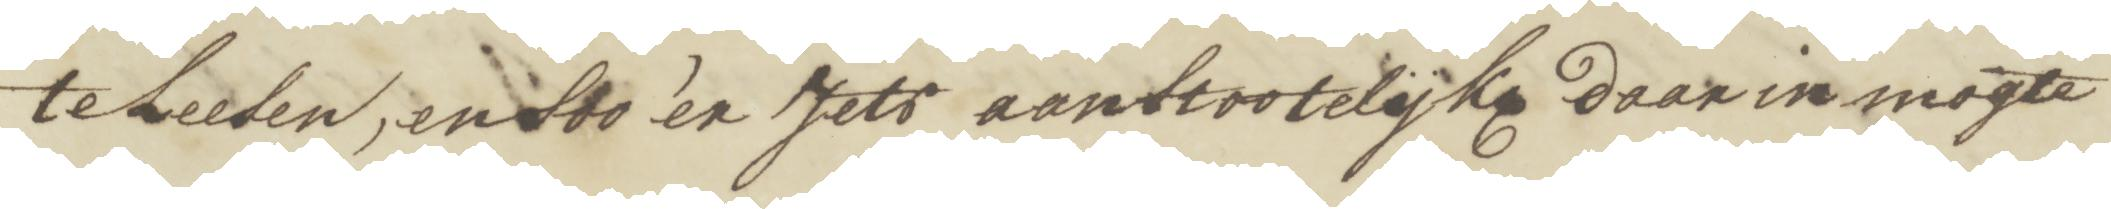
te leesen, en soo 'er Jets aanstootelijk daar in mogte
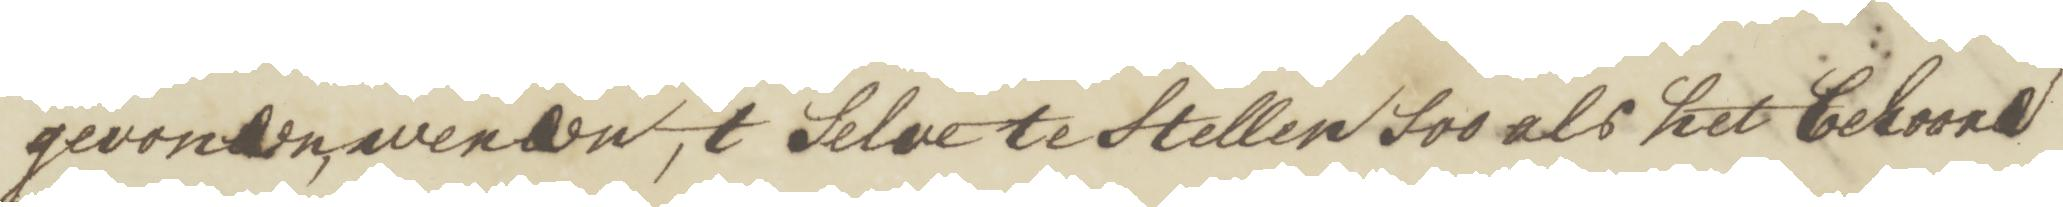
gevonden werden, ’t selve te stellen soo als het behoord
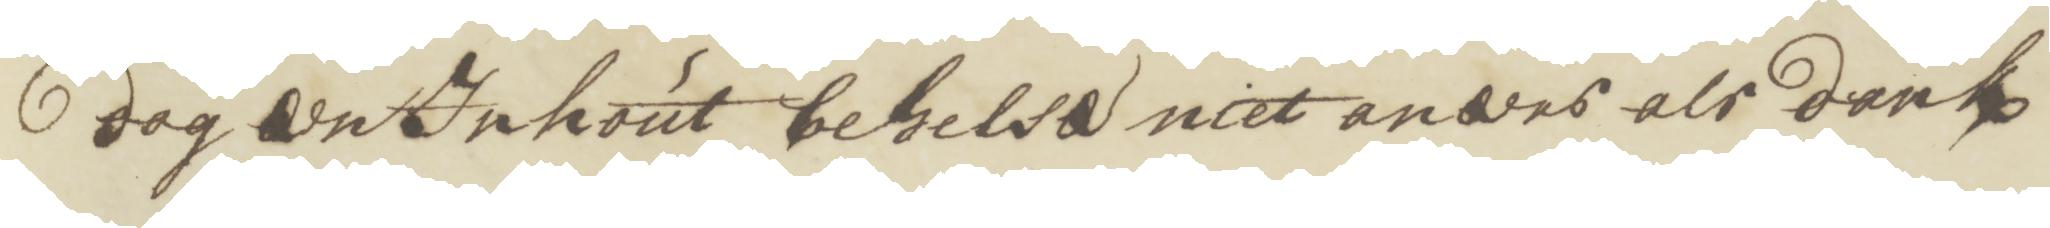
dog den Inhout behelsd niet anders als dank
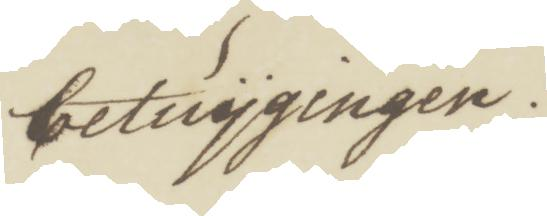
betuijgingen.
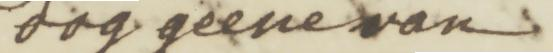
dog geene van
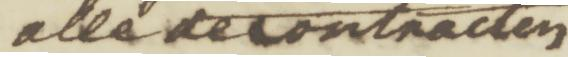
alle de contracten
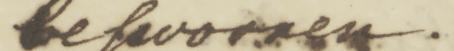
beswooren.
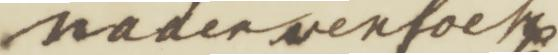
nader versoek
